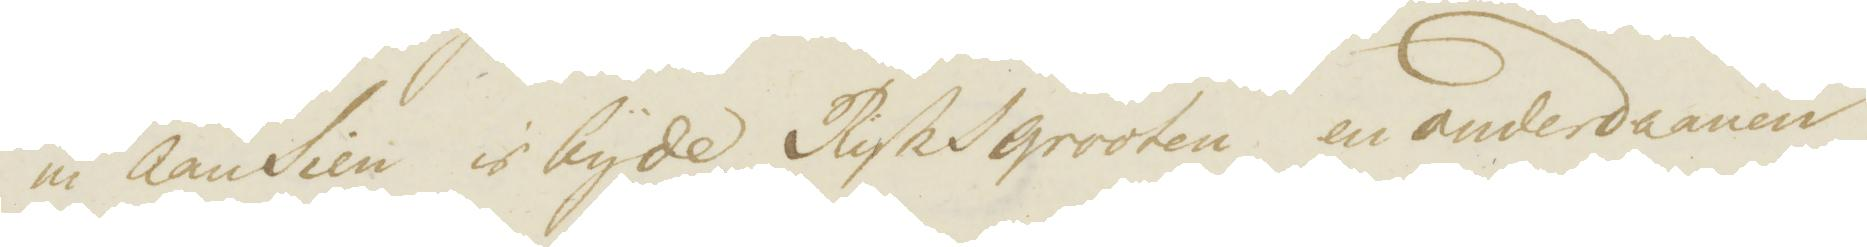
in aansien is bijde Rijksgrooten en onderdaanen
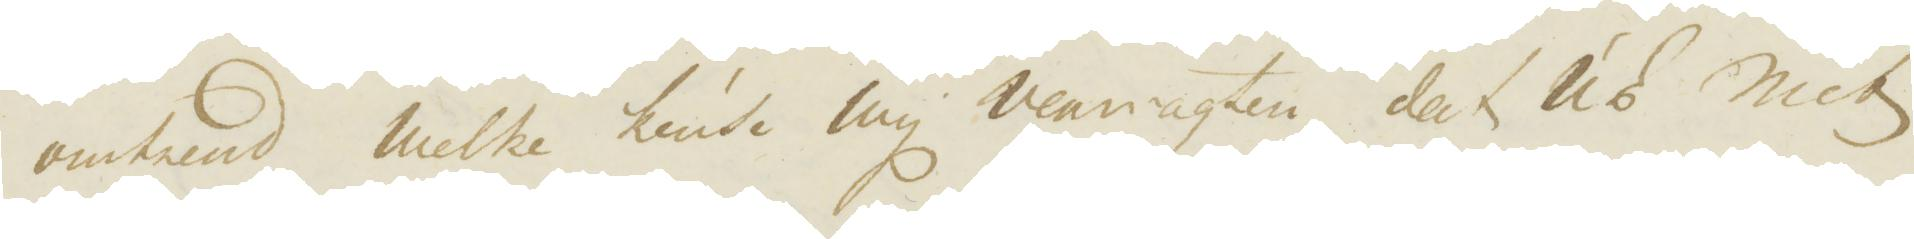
omtrend welke keuse wij verwagten dat uE met
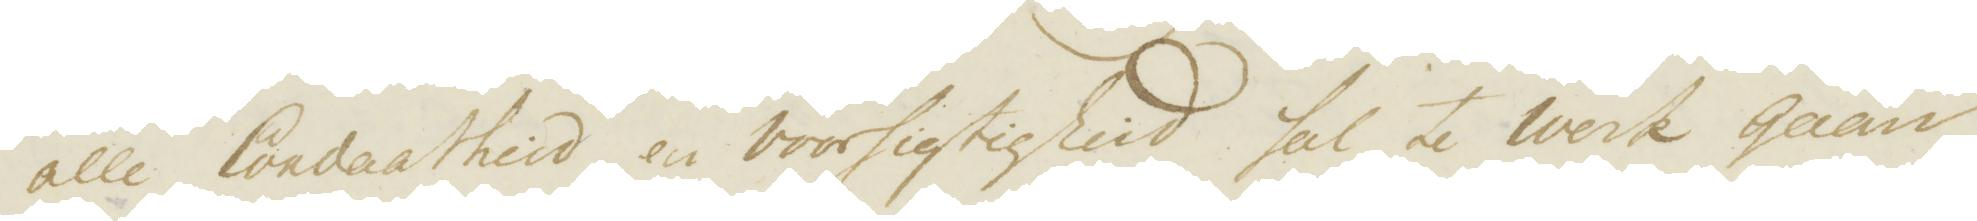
alle Cordaatheid en voorsigtigheid sal te werk gaan
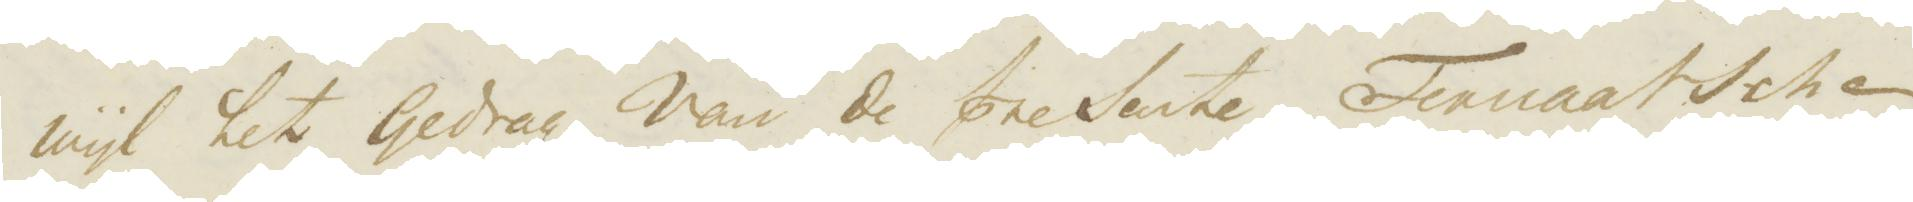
wijl het gedrag van de presente Ternaatschen
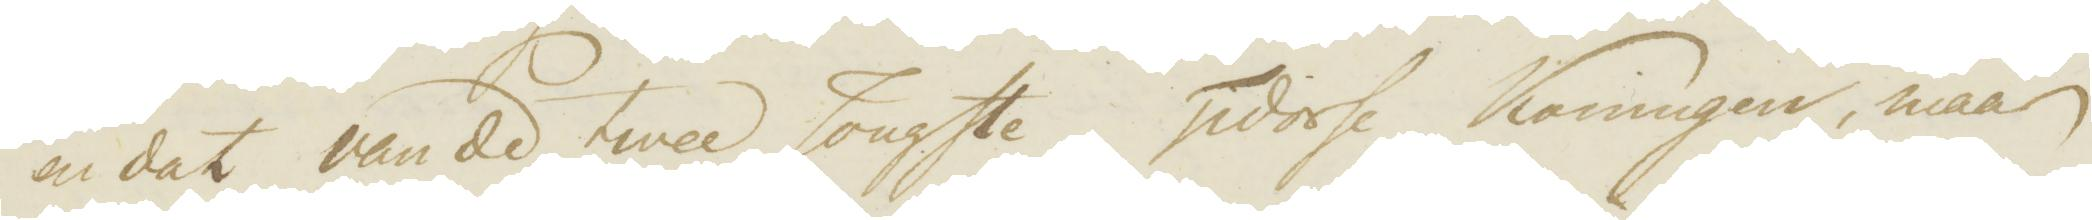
en dat van de twee Jongste Tidorse Koningen, maar
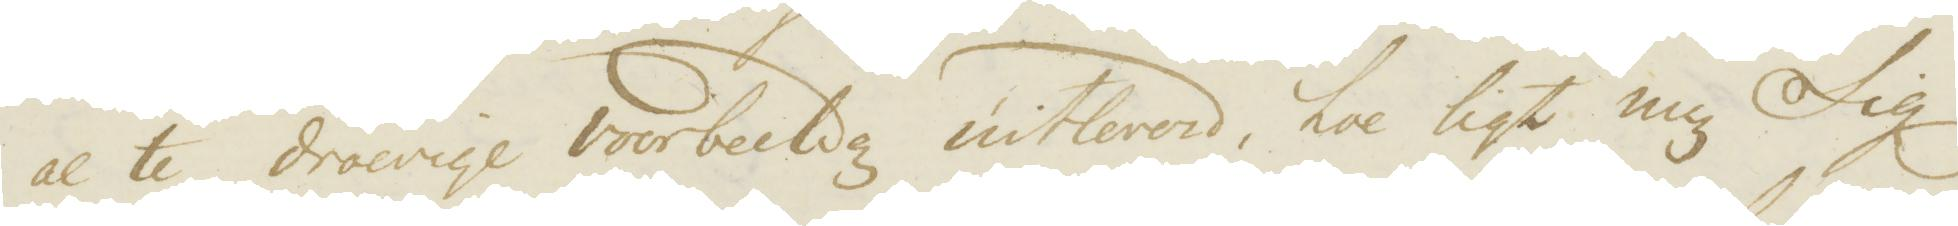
al te droevige voorbeelden uitleverd, hoe ligt men Sig
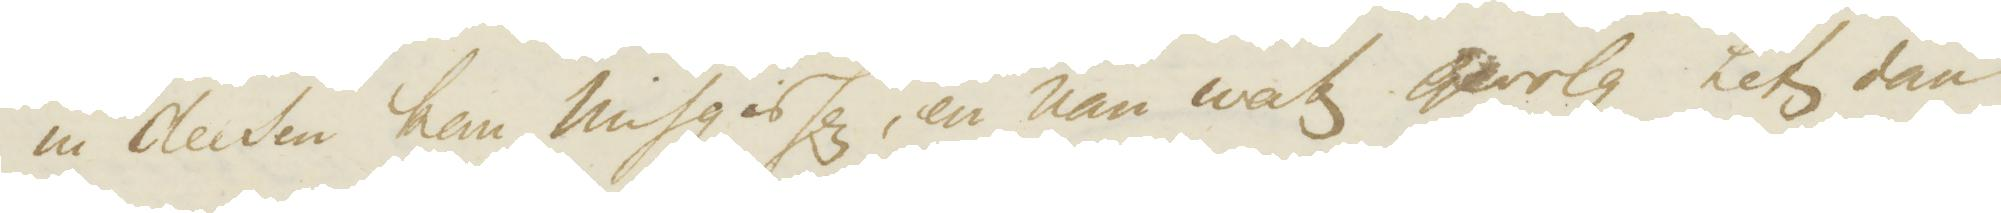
in deesen kan misgissen, en van wat gevolg het dan
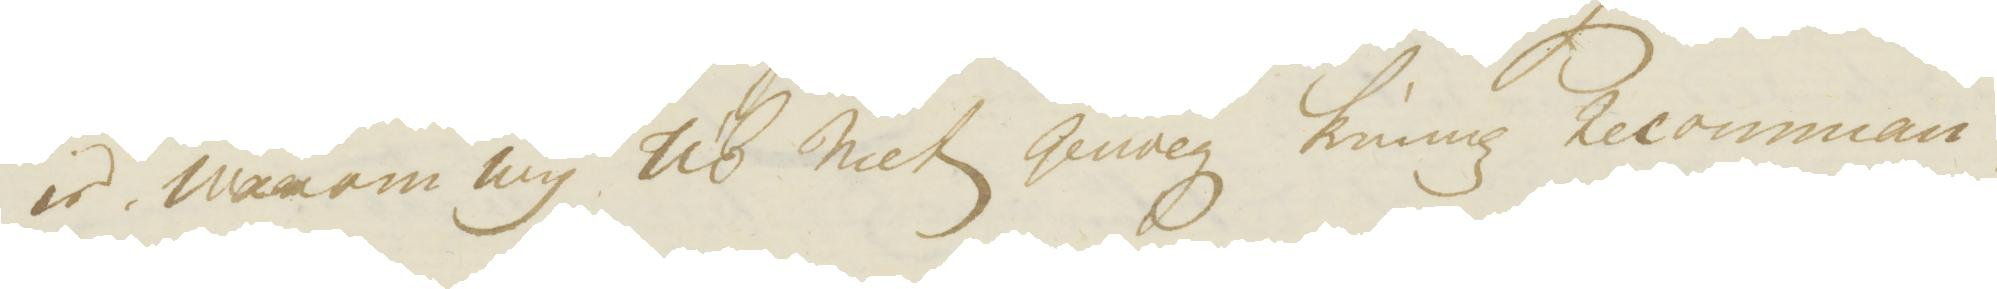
is, waarom wy uE niet genoeg kunnen recomman
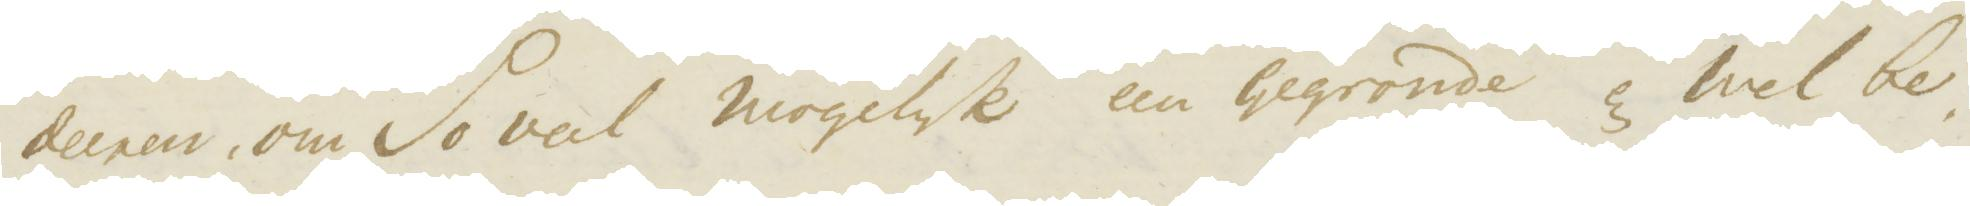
deeren, om So veel mogelyk een gegronde en wel be„
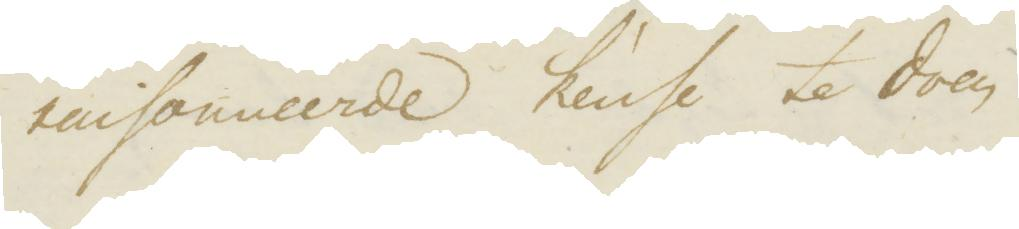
raisonneerde keuse te doen
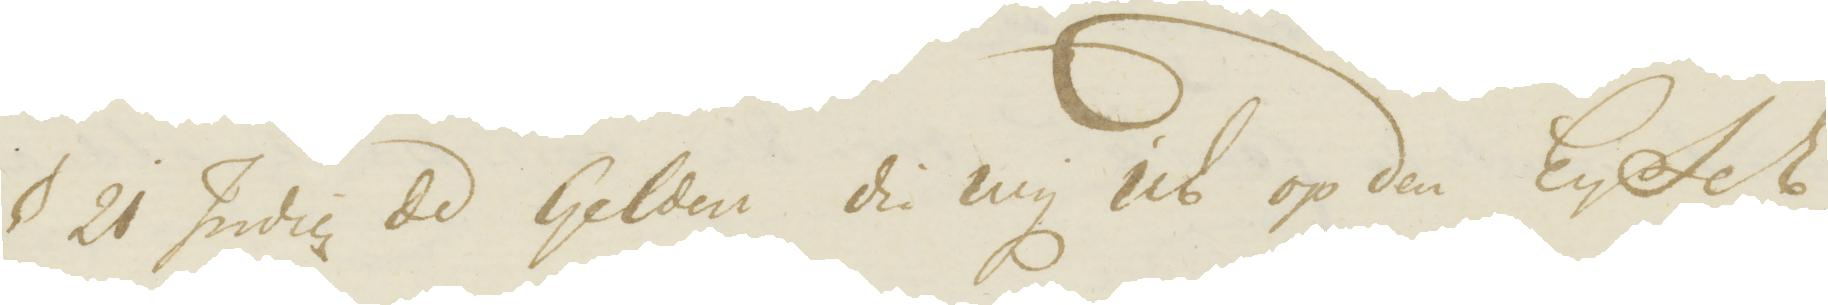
§ 21 Indien de gelden die wij uE op den Eysch
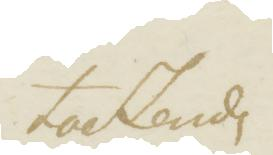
toezenden
